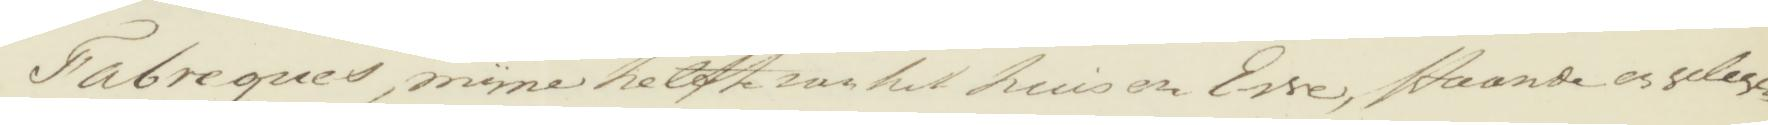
Fabreques, mijne helft van het huis en Erve, staande en gelegen
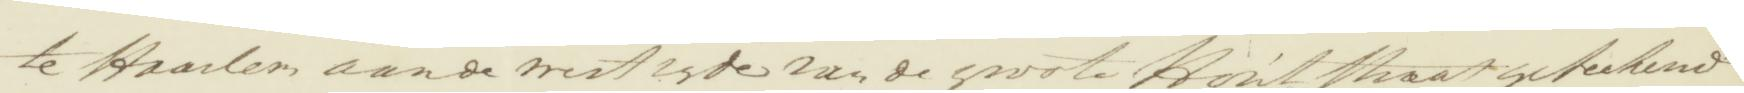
te Haarlem aan de west zyde van de groote Houtstraat geteekend
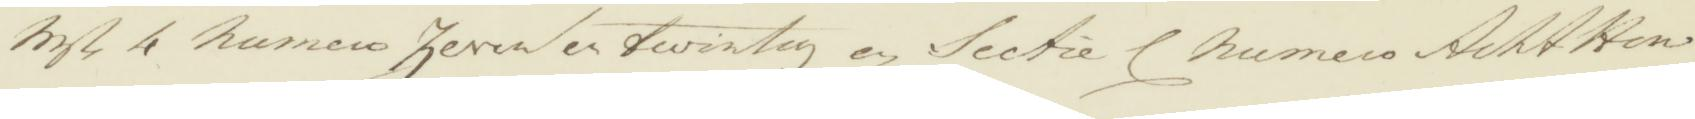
Wyk 4 numero Zeven en twintig en sectie C numero Acht hon
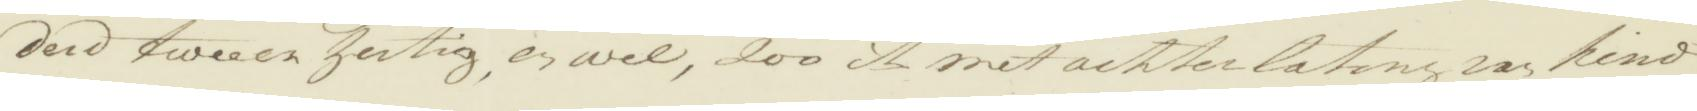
derd twee en zestig, en wel, zoo ik met achterlating van kind
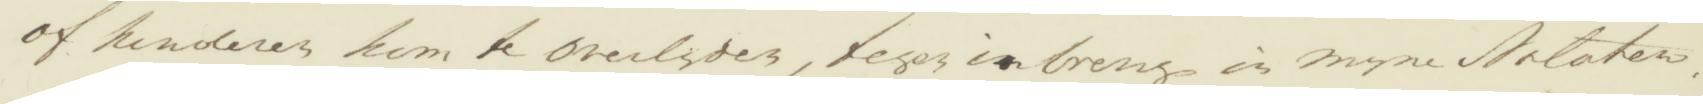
of kinderen kom te overlijden, tegen inbrengen in myne Nalaten,
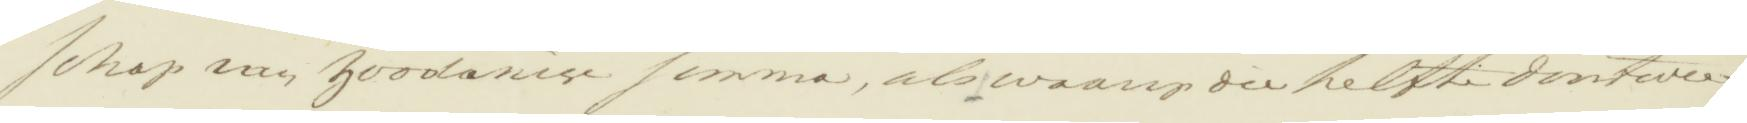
schap van zoodanige somma, als waarop die helfte den twee
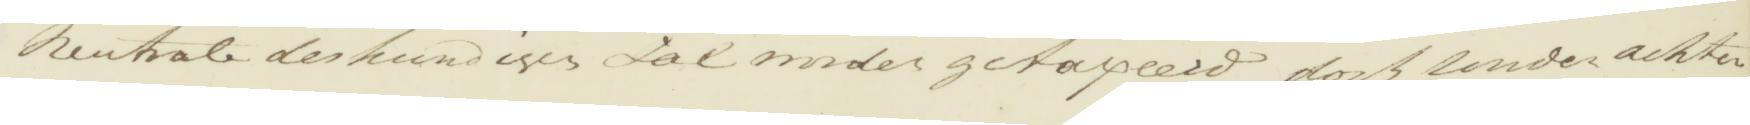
Neutrale deskundigen zal worder getaxeerd, doch zonder achter
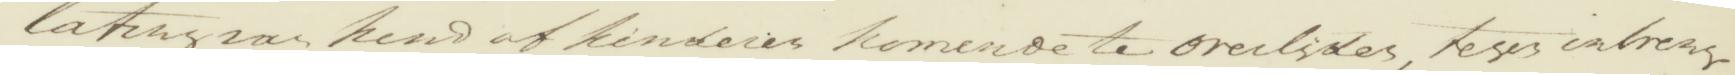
lating van kind of kinderen komende te overlijden, tegen inbreng
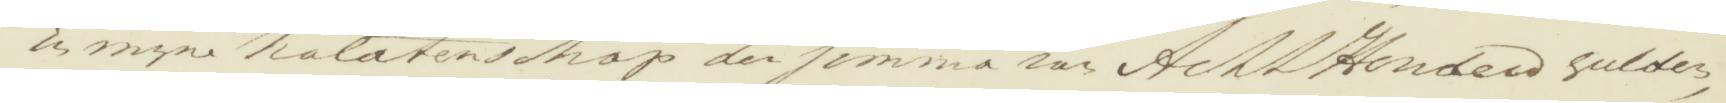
in myne nalatenschap den somma van Acht Honderd gulden,
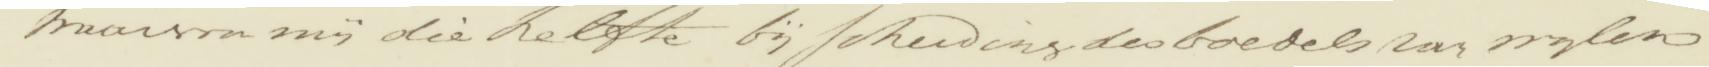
waarvan mij die helfte bij scheiding des boedels van wylen
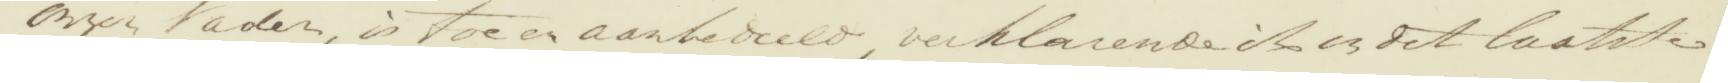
onzer Vader is toe en aanbedeeld, verklarende ik in dit laatste
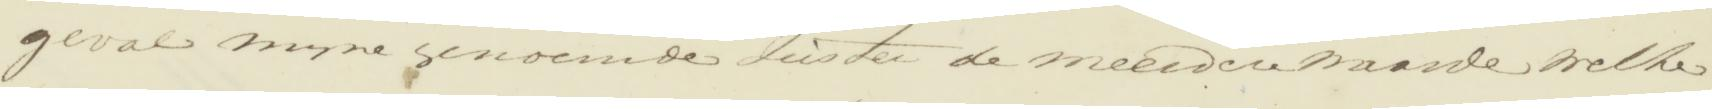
geval myne genoemde zuster de meerdere waarde welke
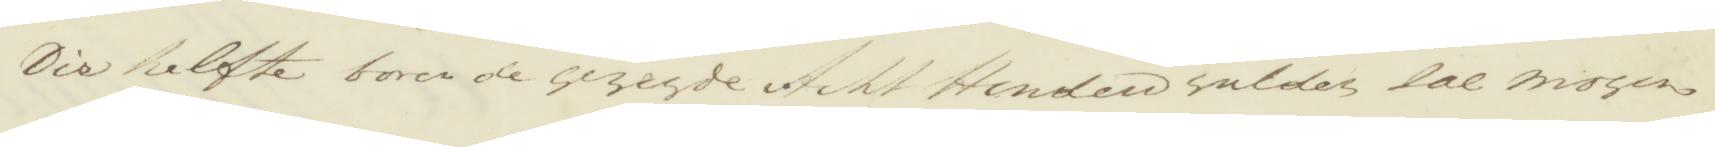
die helfte boven de gezegde Acht Honderd gulden zal mogen
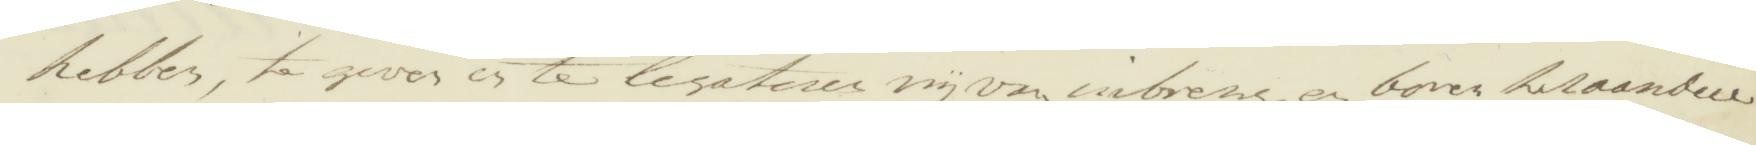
hebben, te geven en te legateren mij van inbreng en boven het aandeel
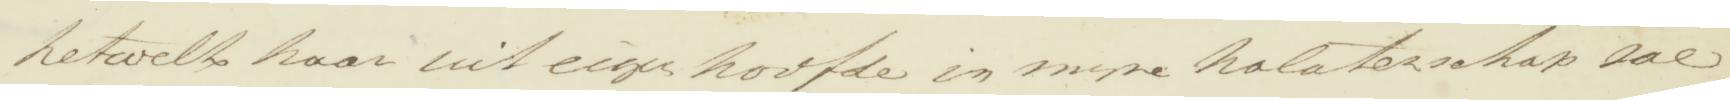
hetwelk haar uit eigen hoofde in myne nalatenschap zal
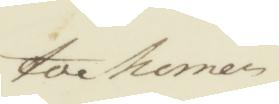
toekomen
